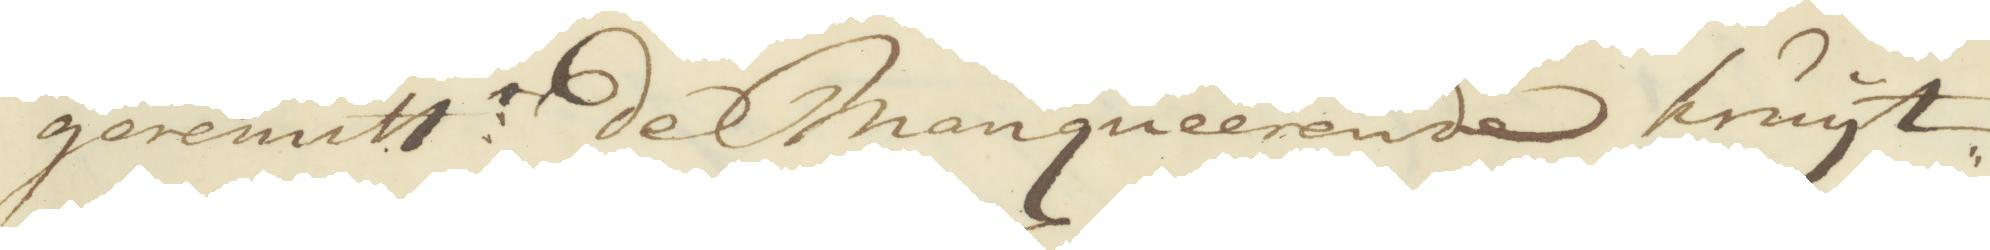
geremitt:t de manqueerende kruijt„
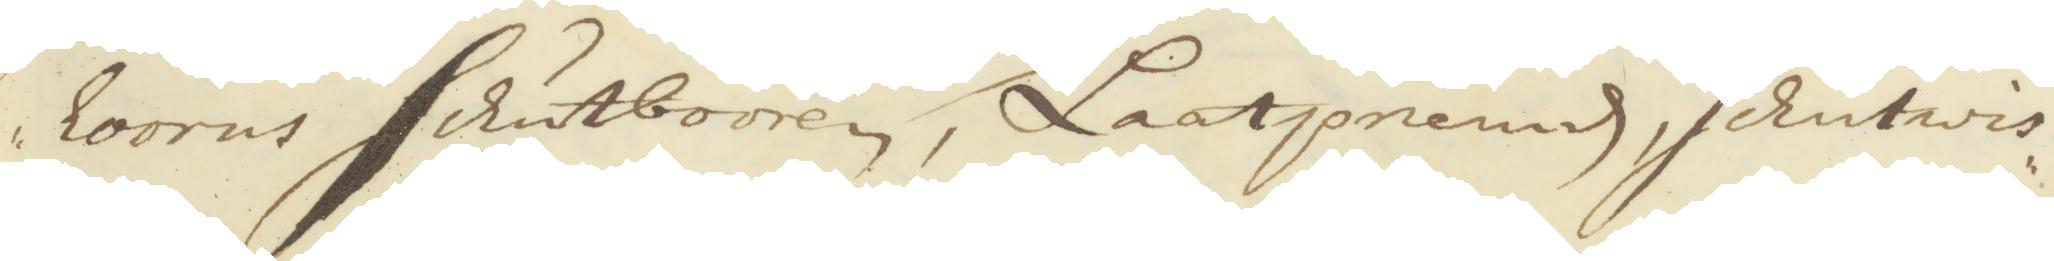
„hoorns schutbooren, laatpriemen, schutwis„
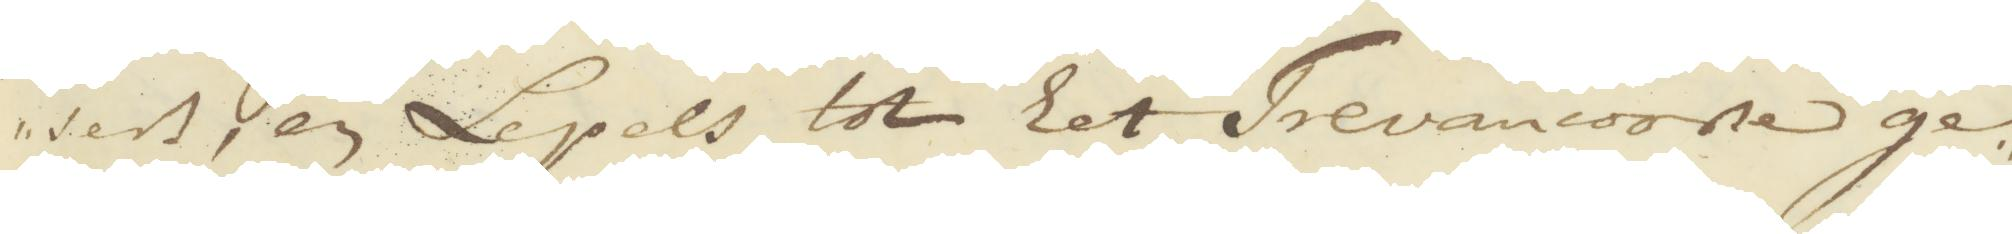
„sers, en lepels tot het Trevancoore ge„
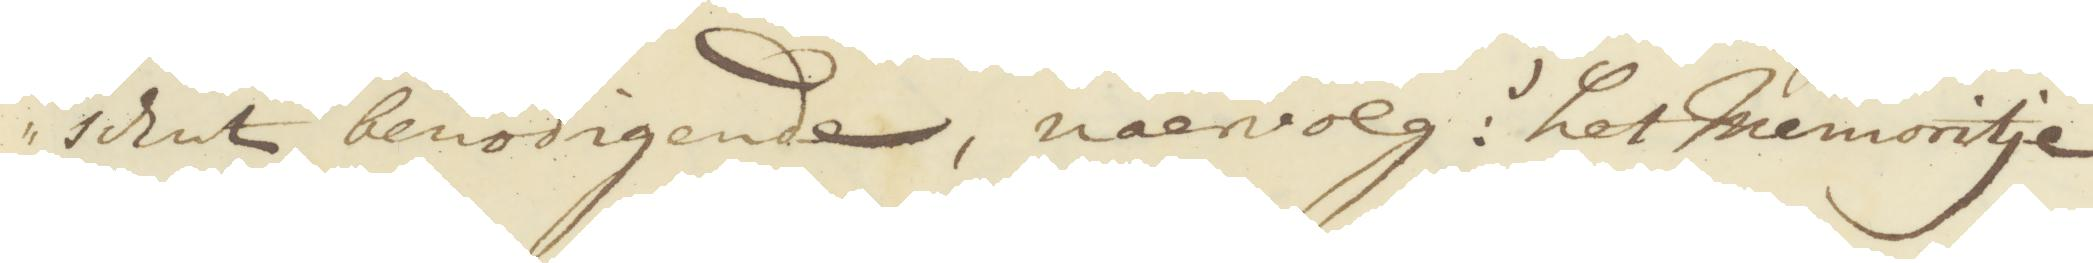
„schut benodigende, naevolg:s het memoritje
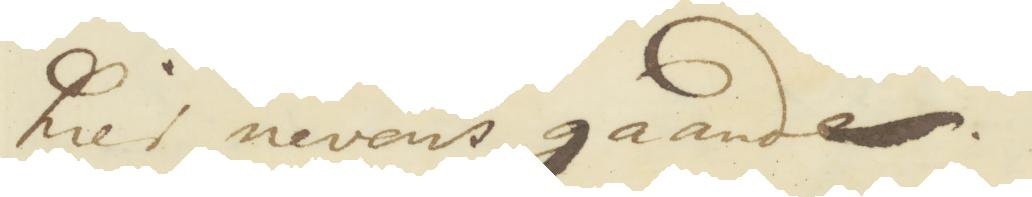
hier nevens gaande.
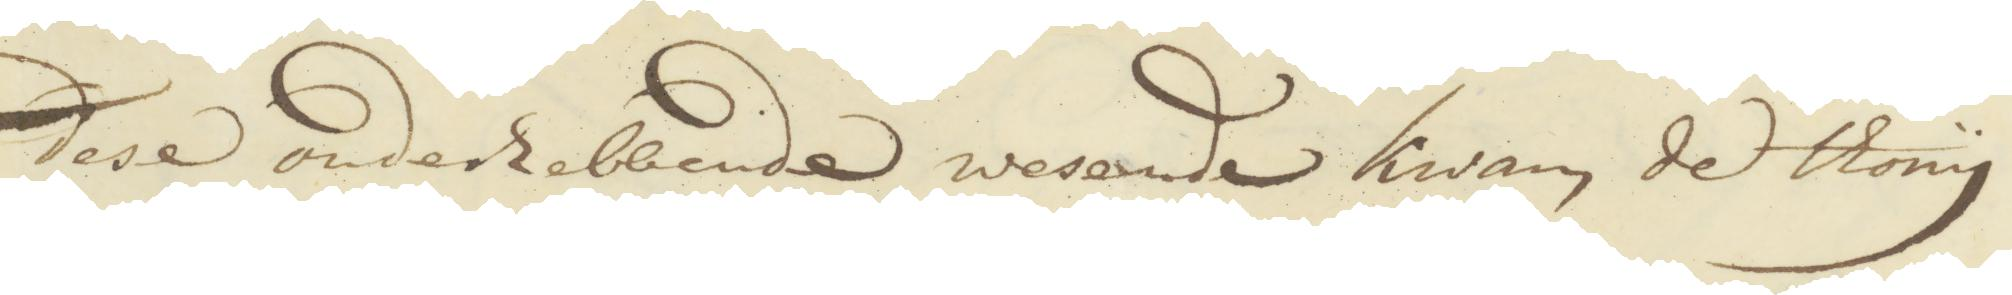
dese onderhebbende wesende kwan de thonij
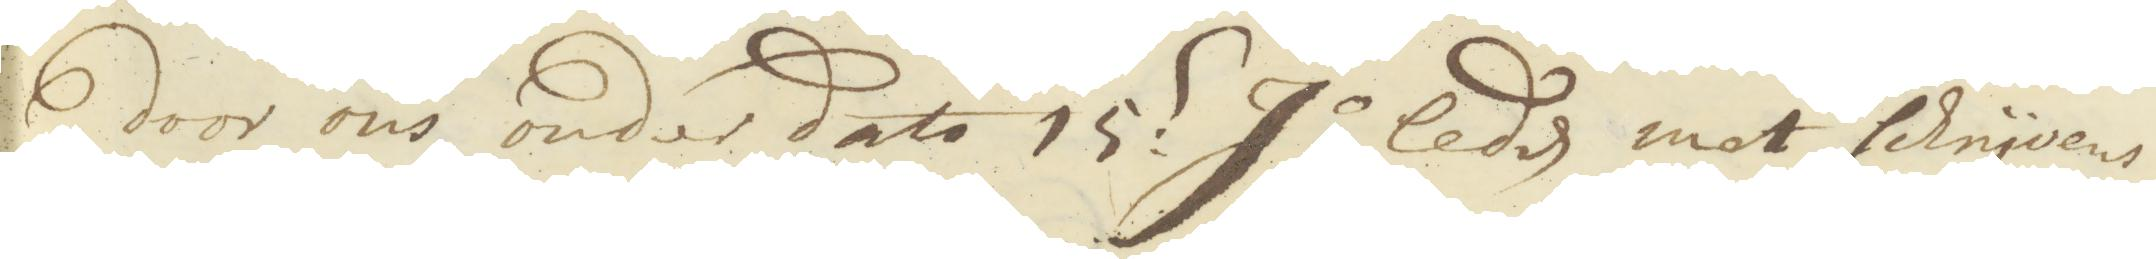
door ons onder dato 15:' J:o leden met schrijvens
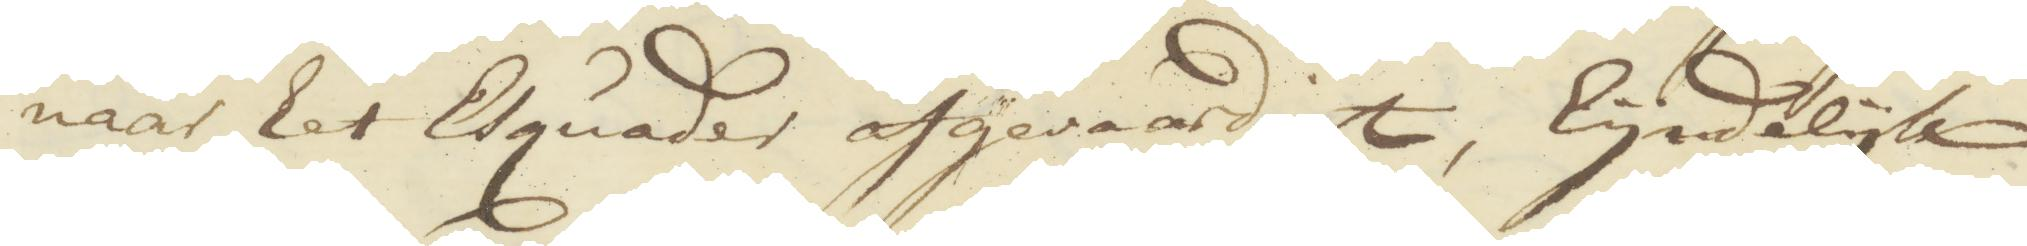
naar het Esquader afgevaardigt, Eijndelijk
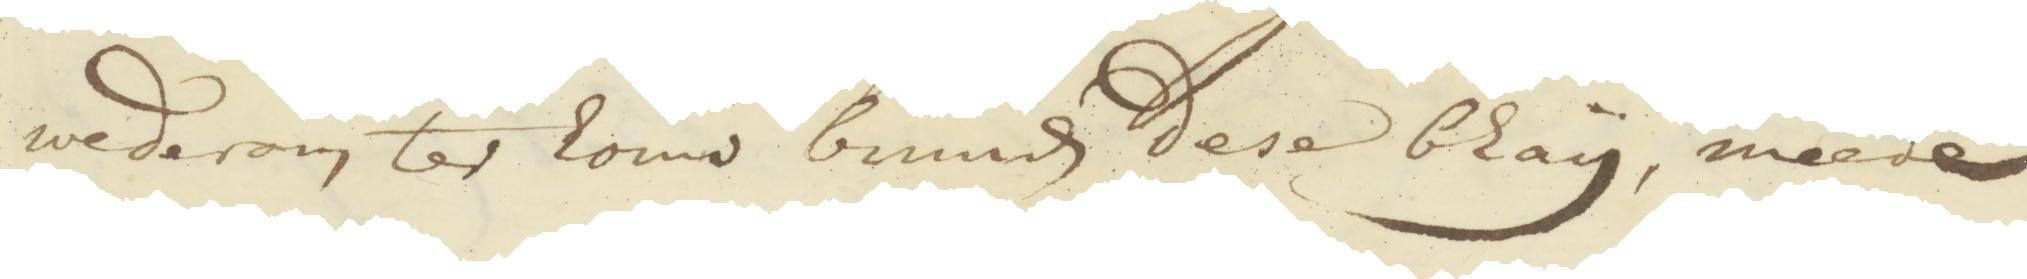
wederom ter houne binnen dese bhaij, meede
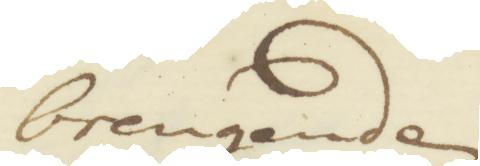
brengende
